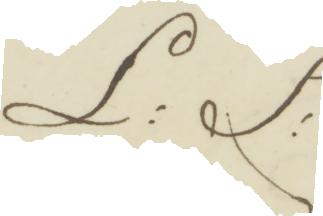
L: S:
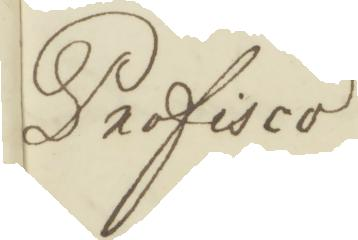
Profisco.
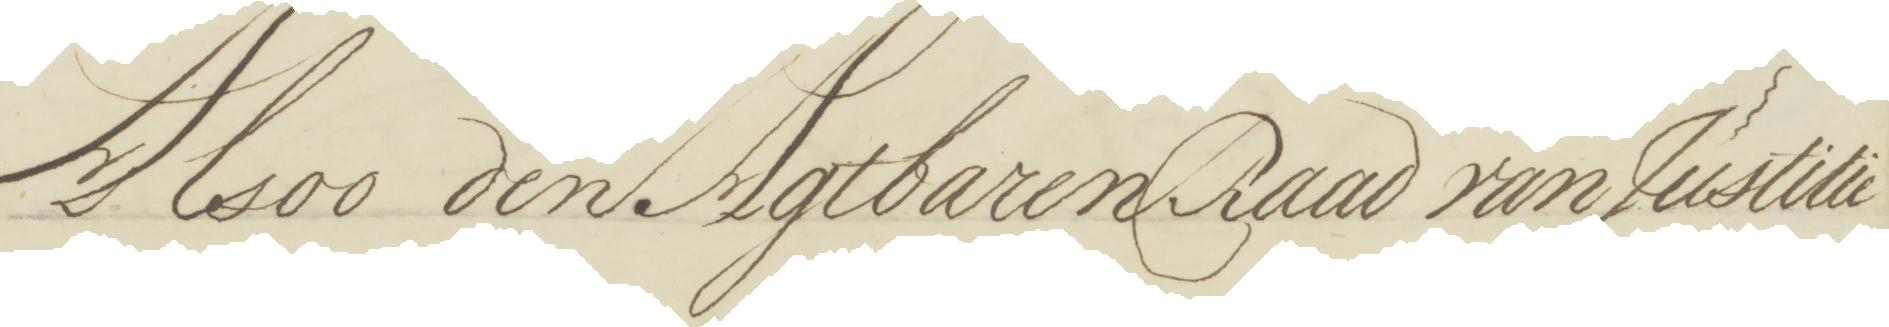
Alsoo den Agtbaren Raad van Justitie
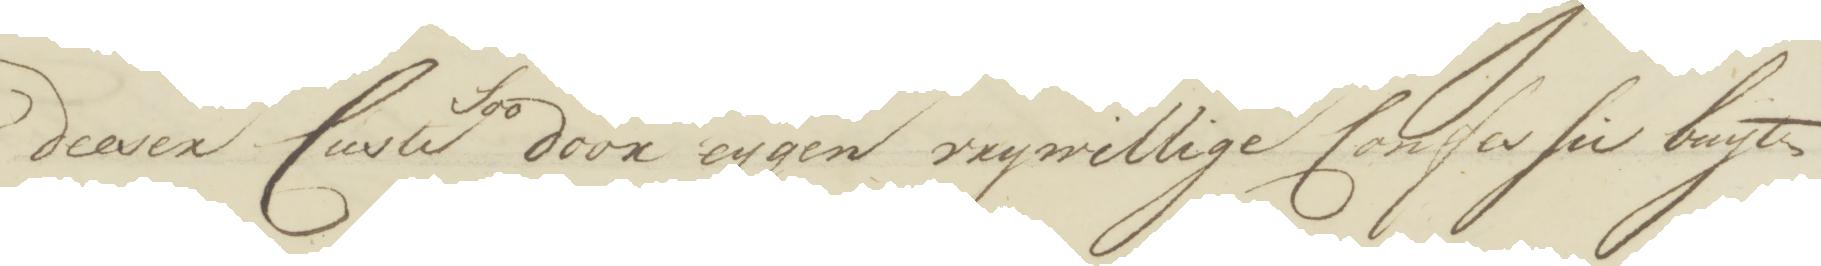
deeser Custe soo door eygen vrywillige Confessie buijten
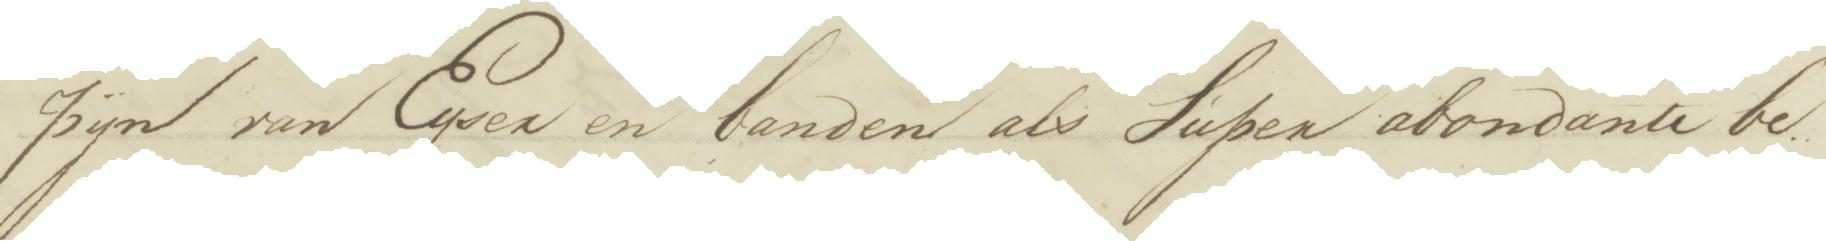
pijn van Eyser en banden als super abondante be
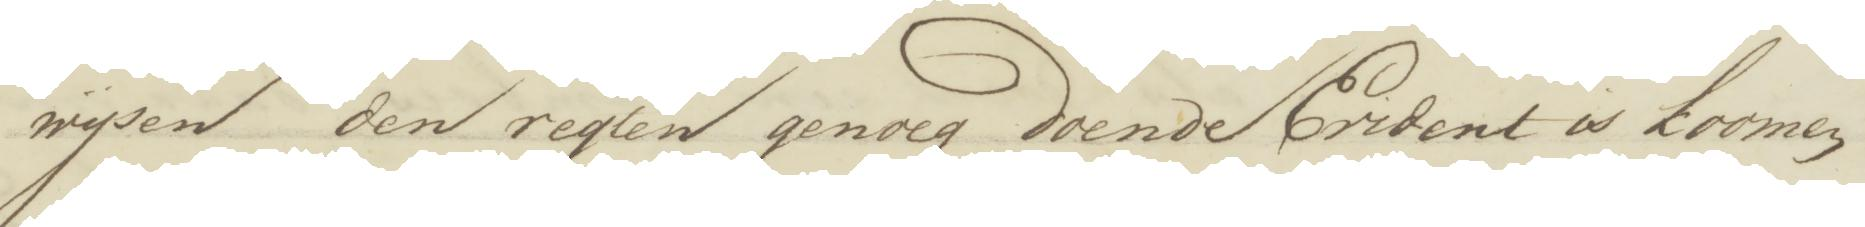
wijsen den regten genoeg doende Evident is koomen
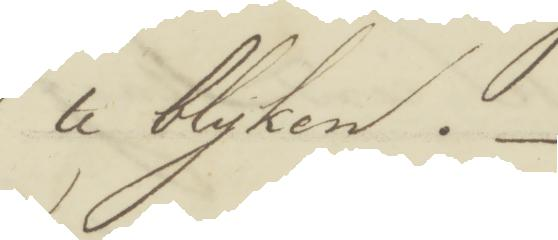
te blijken.
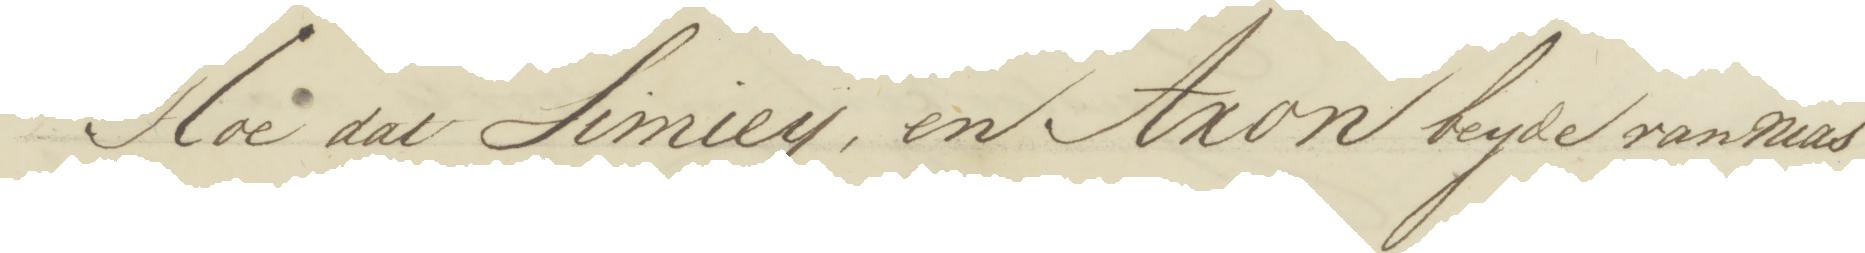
Hoe dat Simieij, en Aron beyde van nias
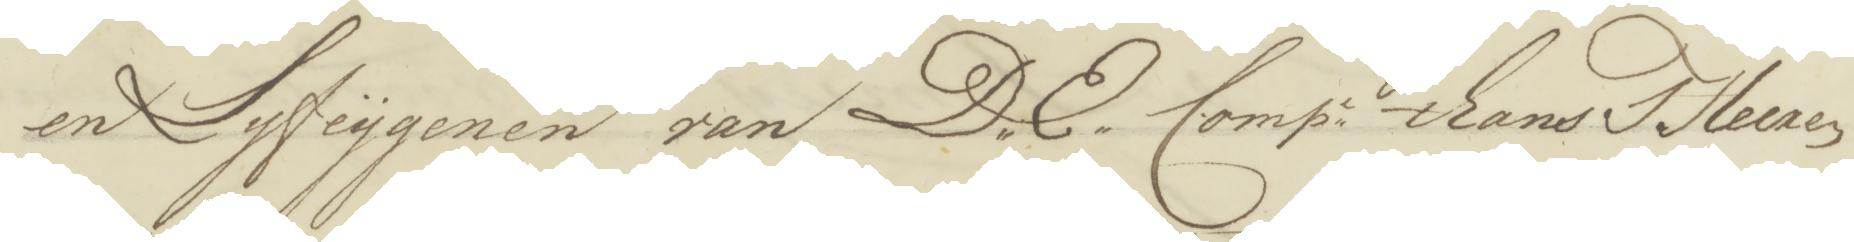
en Lyfeijgenen van D„E„ Comp„e thans T Heeren
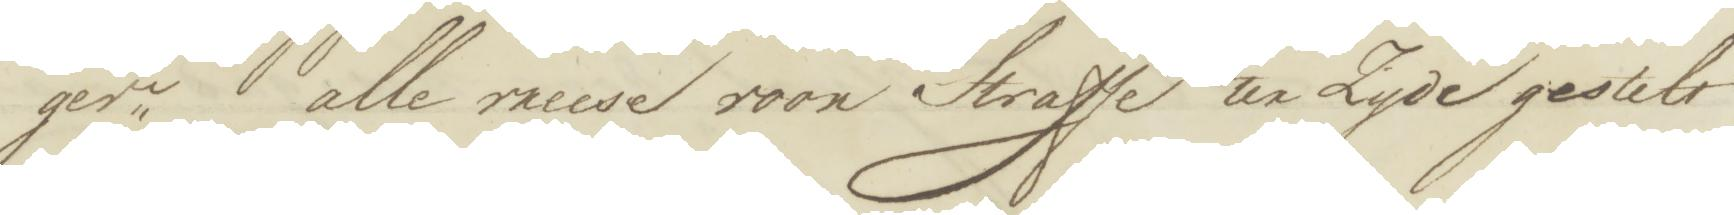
gev„ alle vreese voor straffe ter zijde gestelt
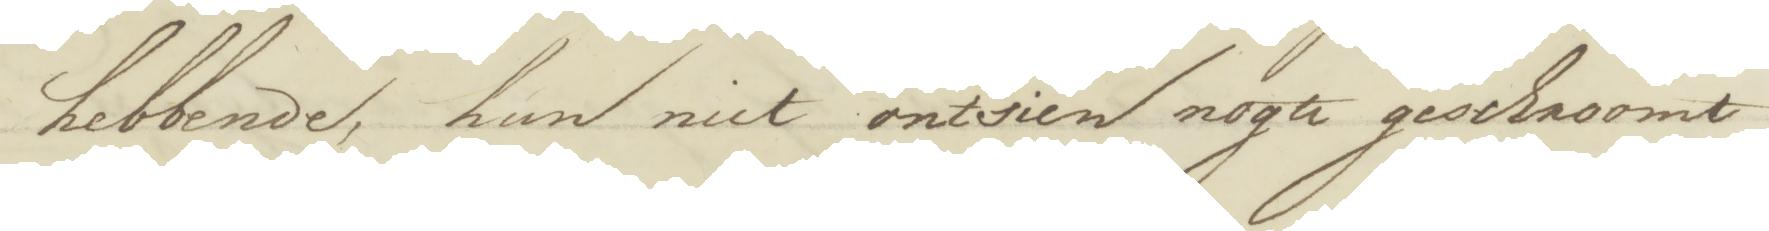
hebbende, hun niet ontsien nogte geschroomt
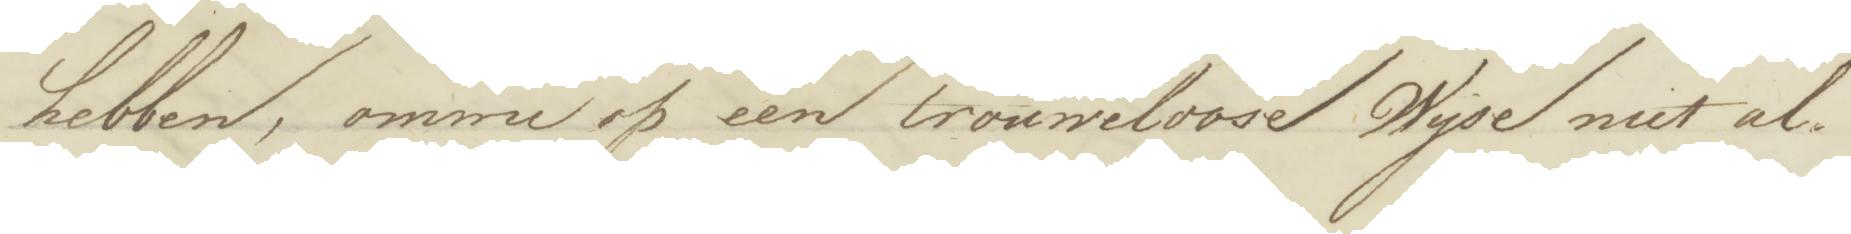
hebben, omme op een trouweloose wijse niet al„
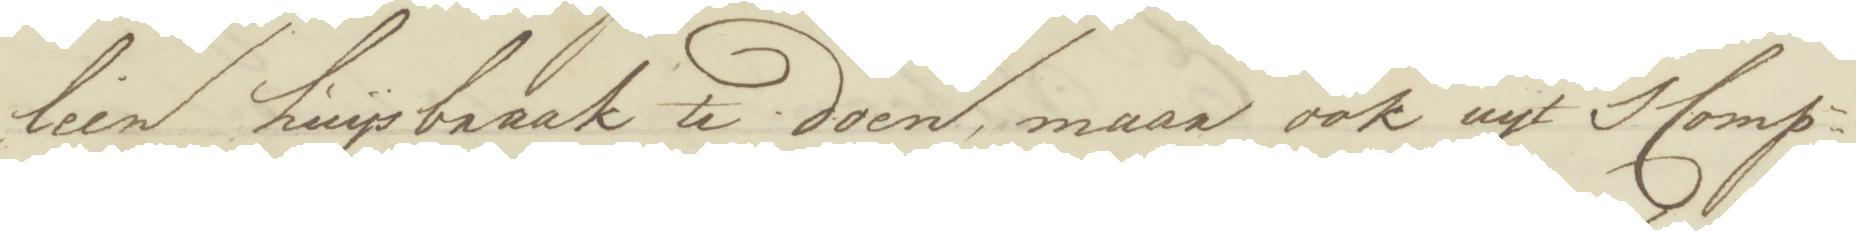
„leen huijsbraak te doen, maar ook uijt S Comp=
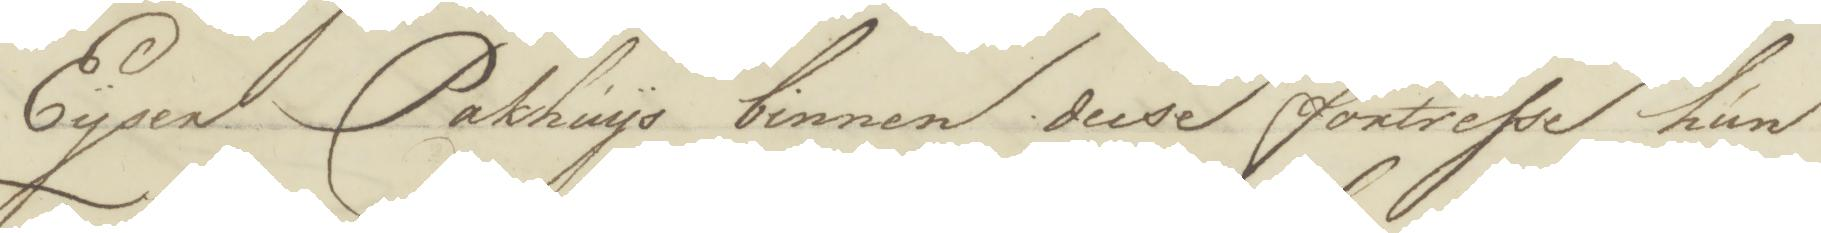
Eijser Pakhuijs binnen deese fortresse hun
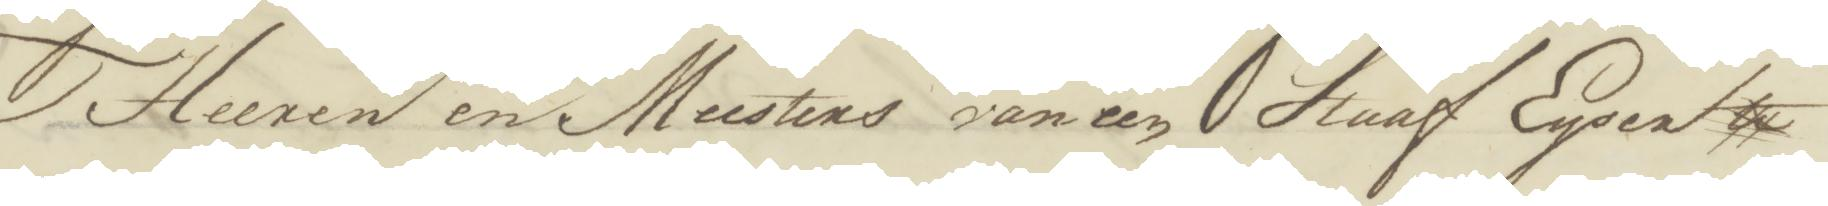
T Heeren en Meesters van een staaf Eyser te
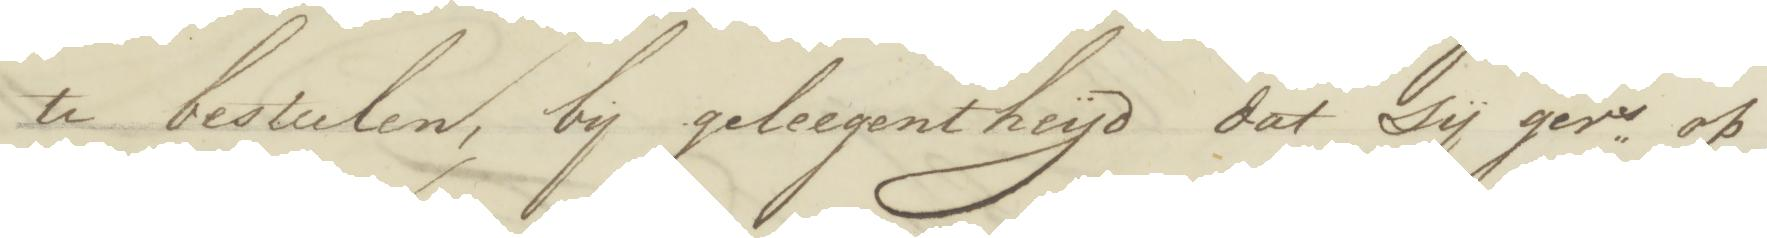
te besteelen, bij geleegentheijd dat sij gev„s op
